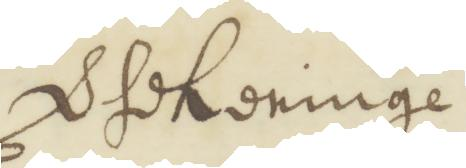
versekeringe
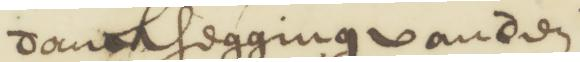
dancksegging van den
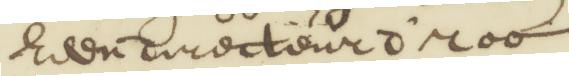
heer directeur d’ roo
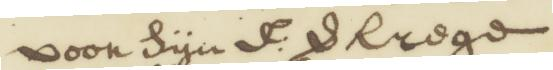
voor sijn E: verkrege
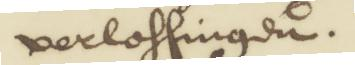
verlossingen.
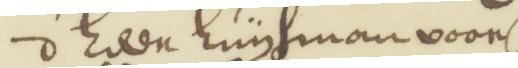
d’ heer huijsman voor
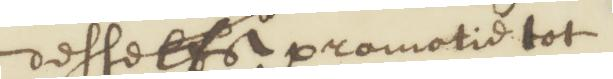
desselfs promotie tot
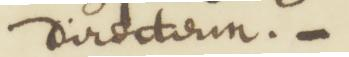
directeur.—
